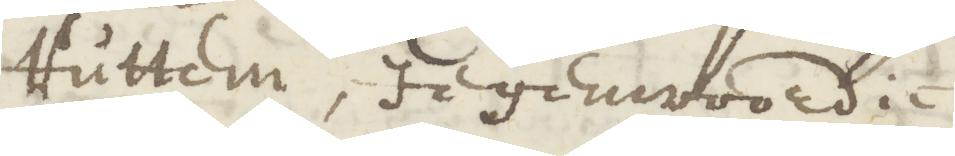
Ruttem, Iegenwoordich
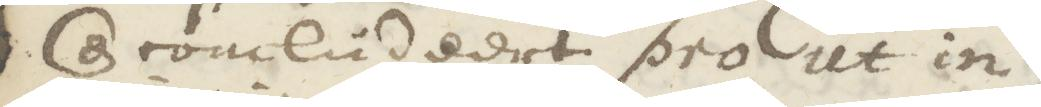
ende concludeert pro ut in
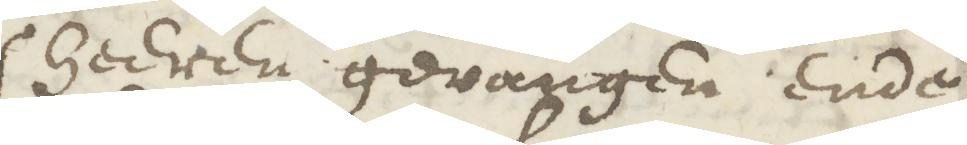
's heeren gevangen ende
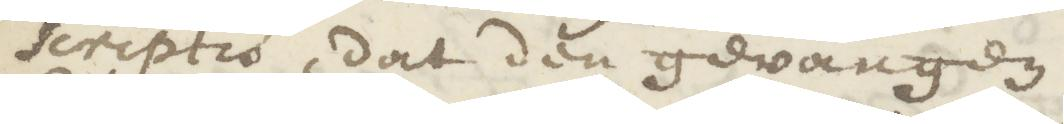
scriptis, dat den gevangen
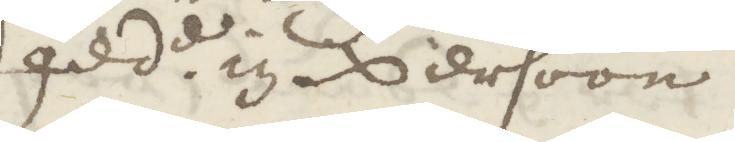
ged.e in persoon
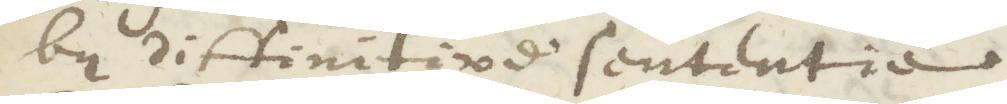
by diffinitive sententie
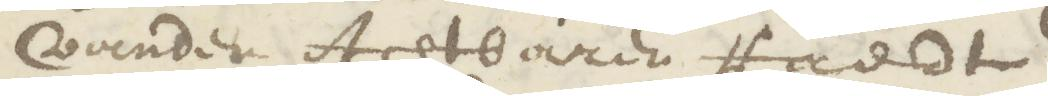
vanden Achtbaren Raedt
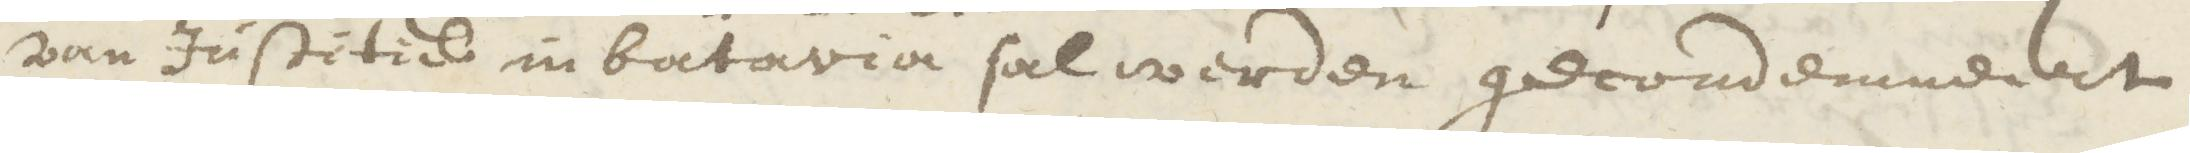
van Iustitie in batavia sal werden gecondemneert
